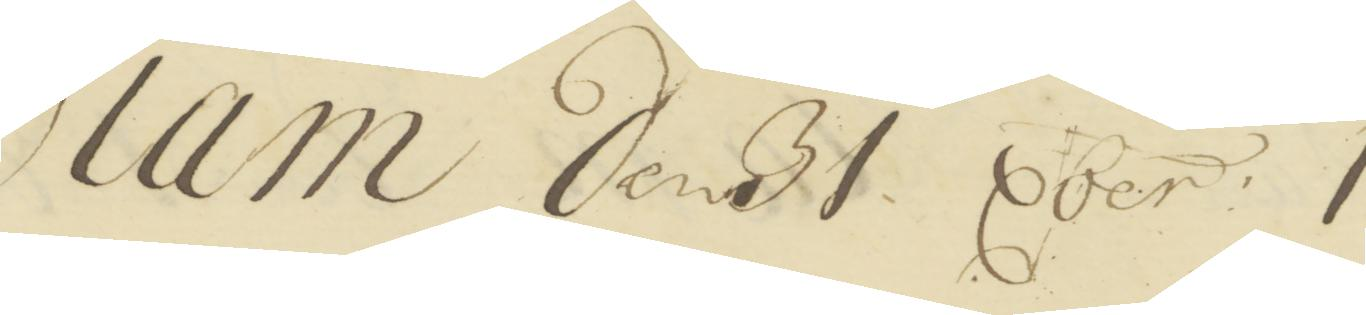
Van Siam den 31. xber. 1732
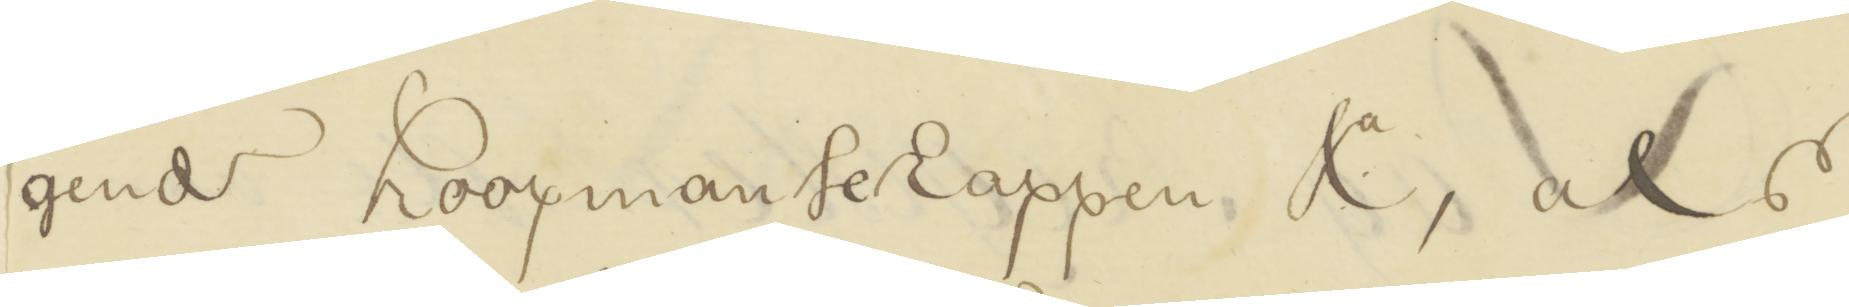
gende koopmanschappen &:a, als
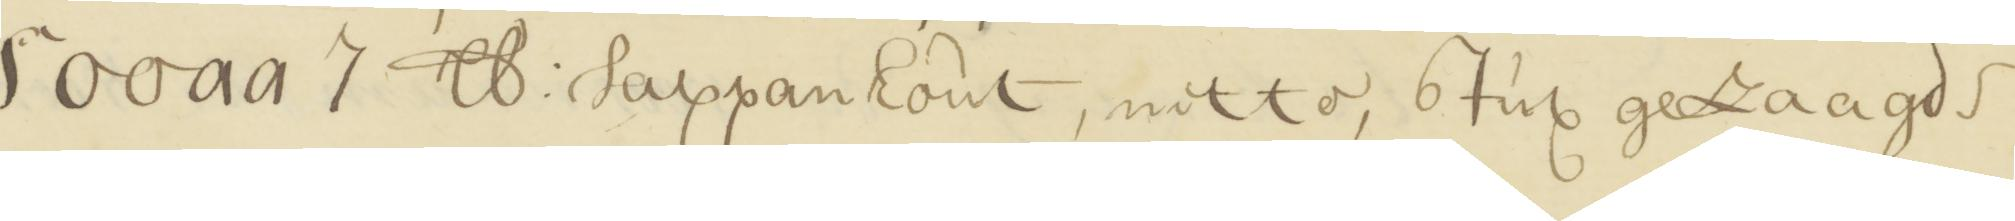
500447 lb: sappanhout, netto, stux gezaagde
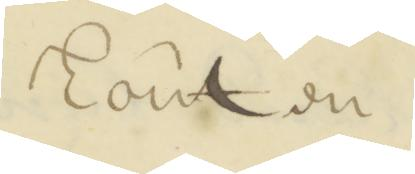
houten
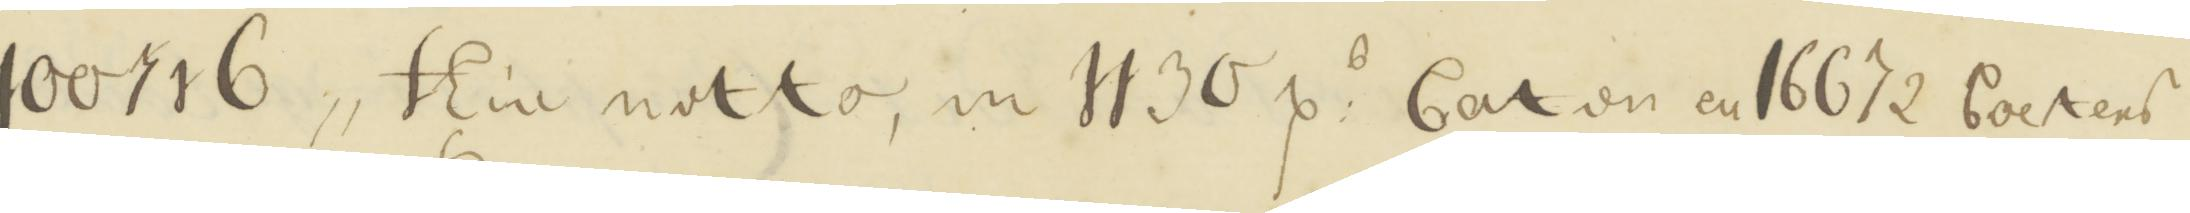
100716 „ thin netto, in 1130 p:s baten en 16672 boeters
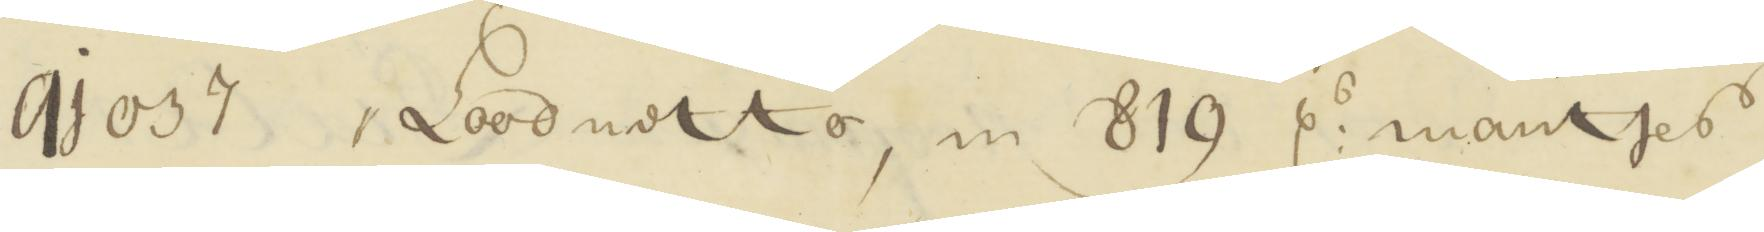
47037 „ Lood netto in 819 p:s mantjes
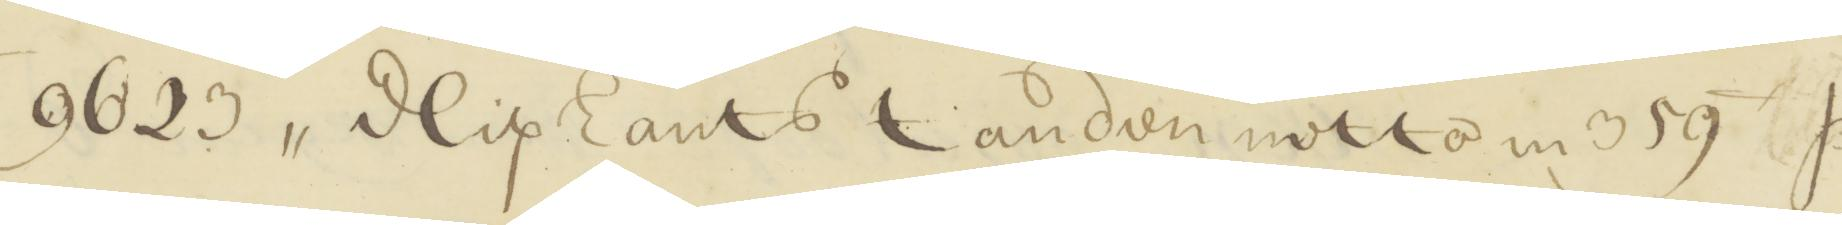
9623 „ Eliphants tanden netto in 359 p:s
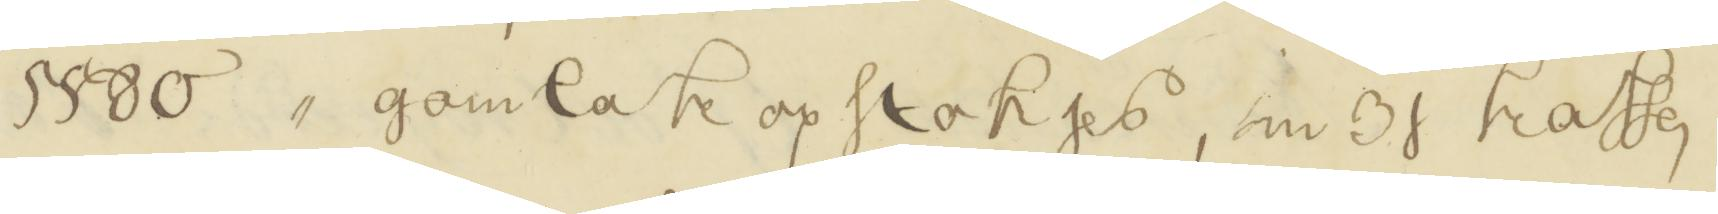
5580 „ gomlak op stokjes, in 31 kassen
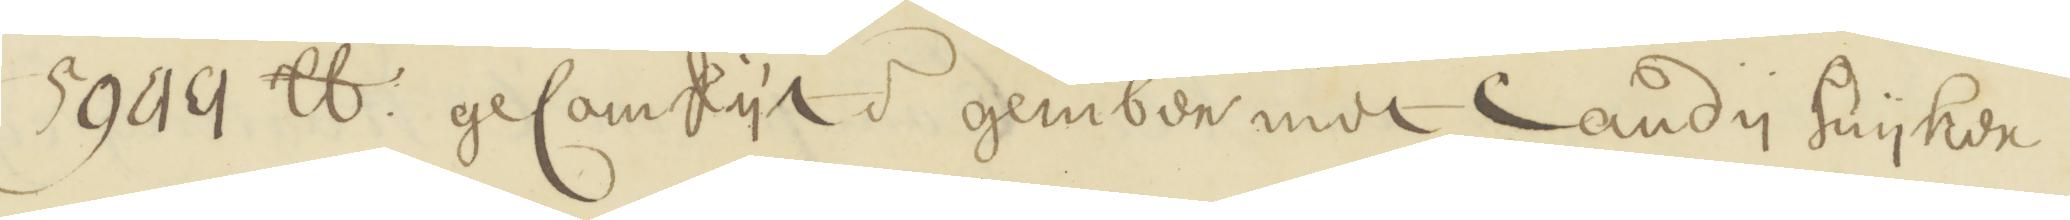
5944 lb: gecomfijte gember met Candij suijker
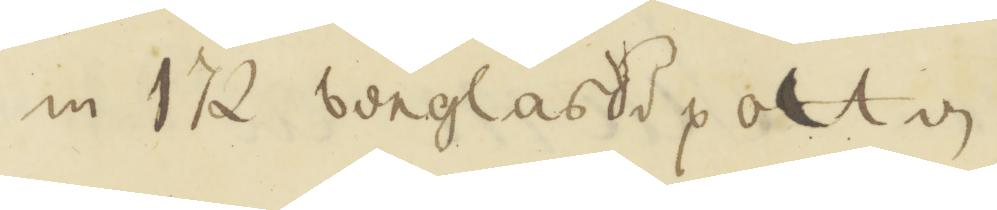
in 172 verglasde potten
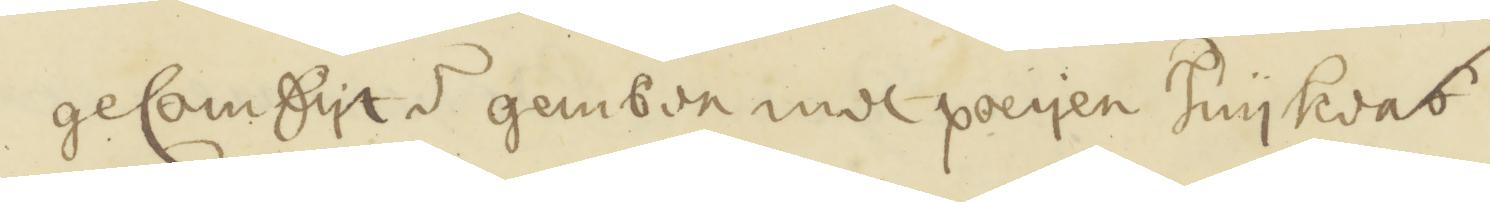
7813 „ gecomfijte gember met poeijer suijkers
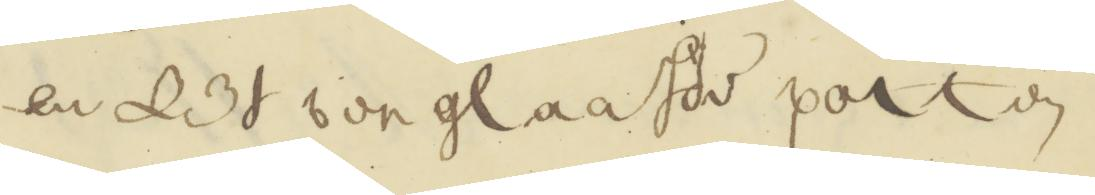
en 231 verglaasde potten
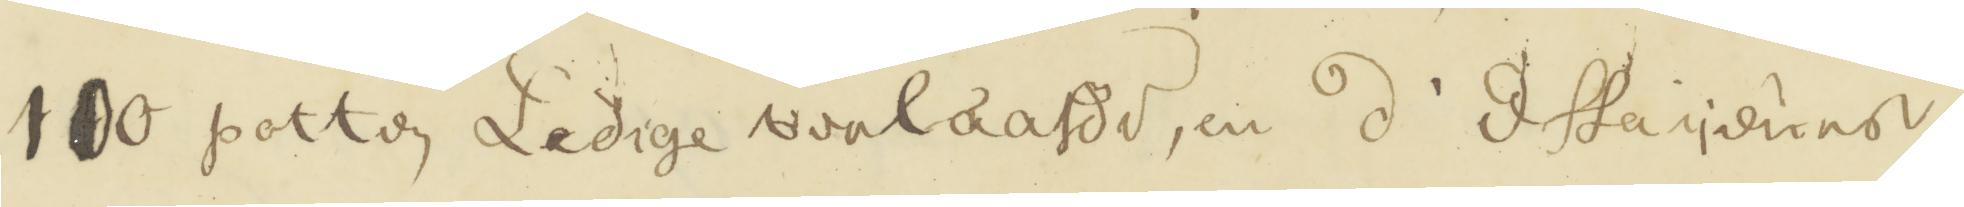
100 potten Ledige verlaasde, en d’ Essaijeurs
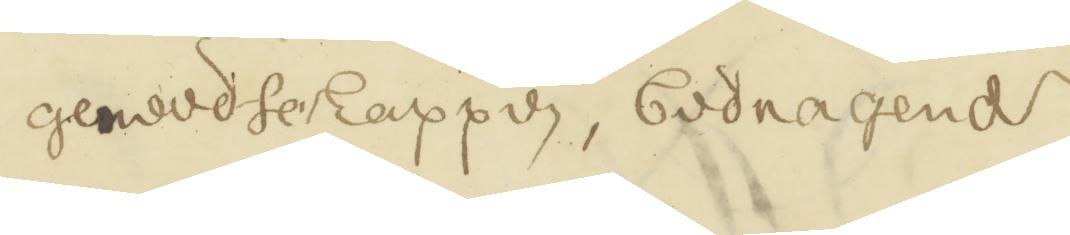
gereedschappen, bedragende
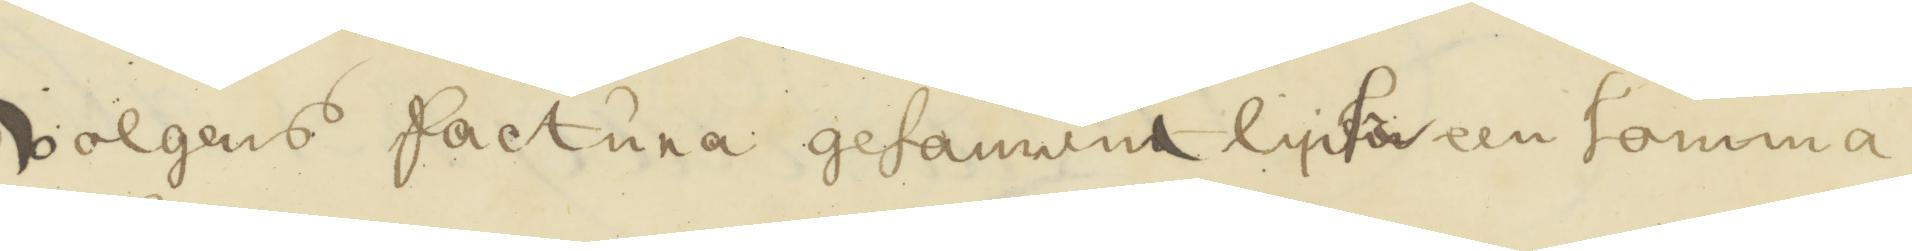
volgens factura gesamentlijck een somma
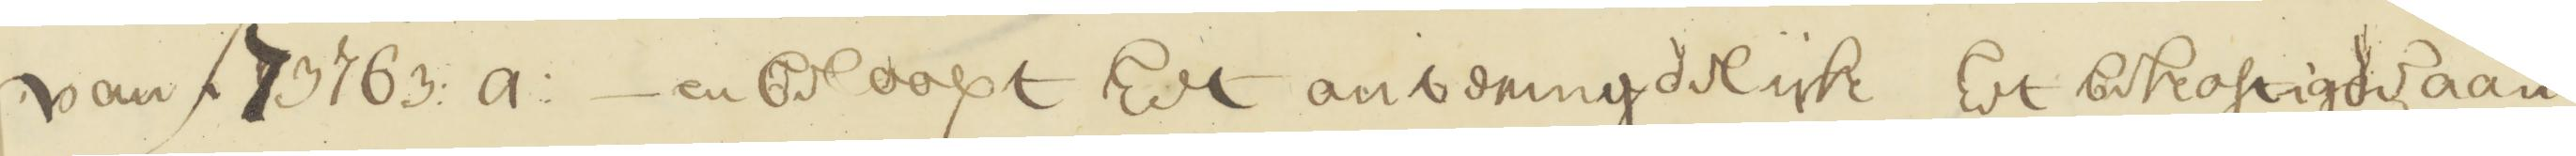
van ƒ73763: 4: — en beloopt het onvermydelijk het bekostigde, aan
